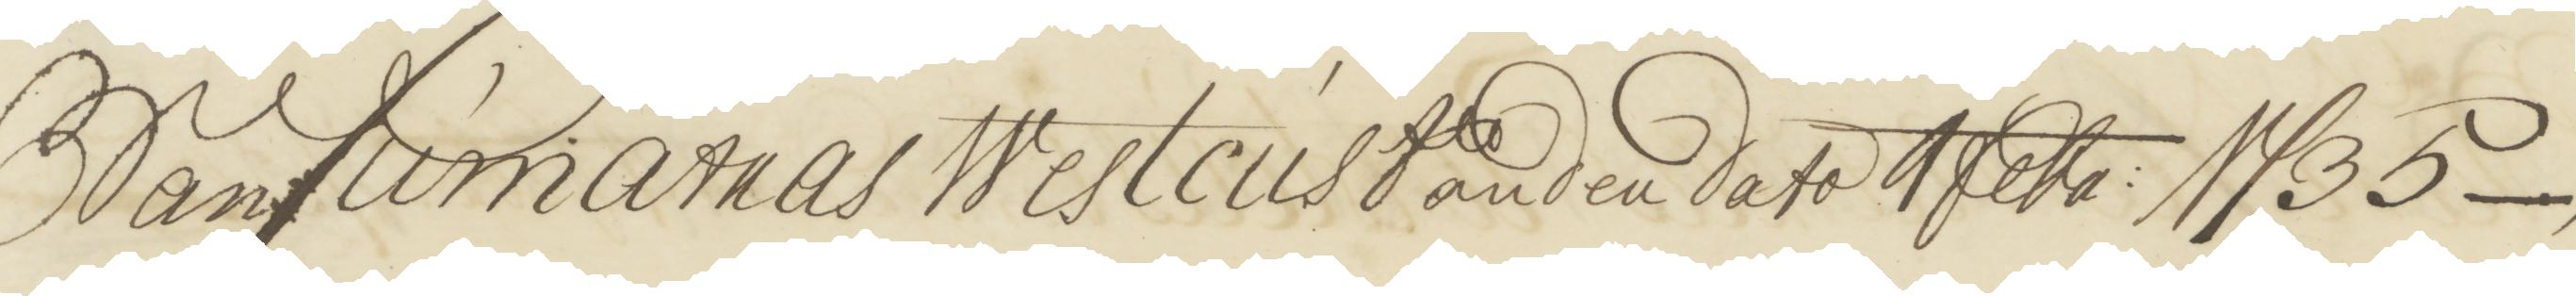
Van Sumatras west cust onder dato 4 febr: 1735_
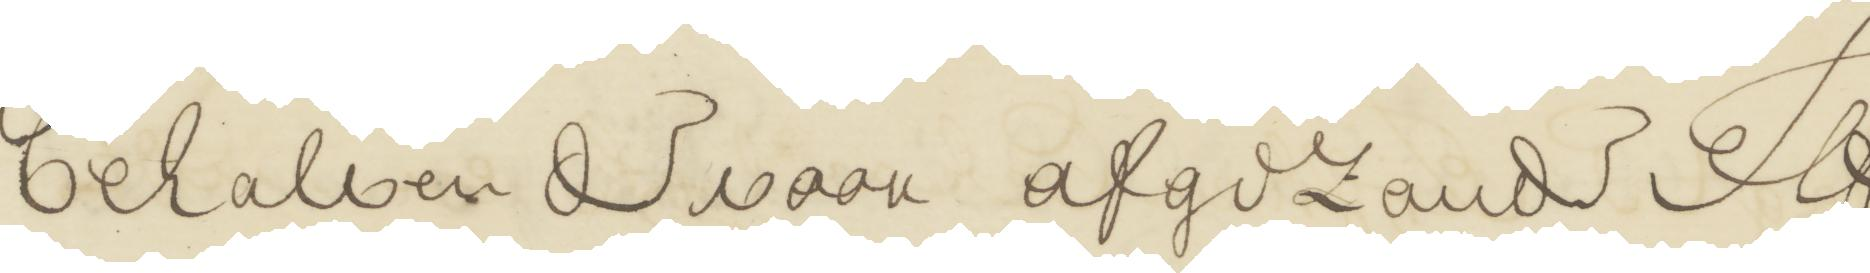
behalven de voor afgezande Elf
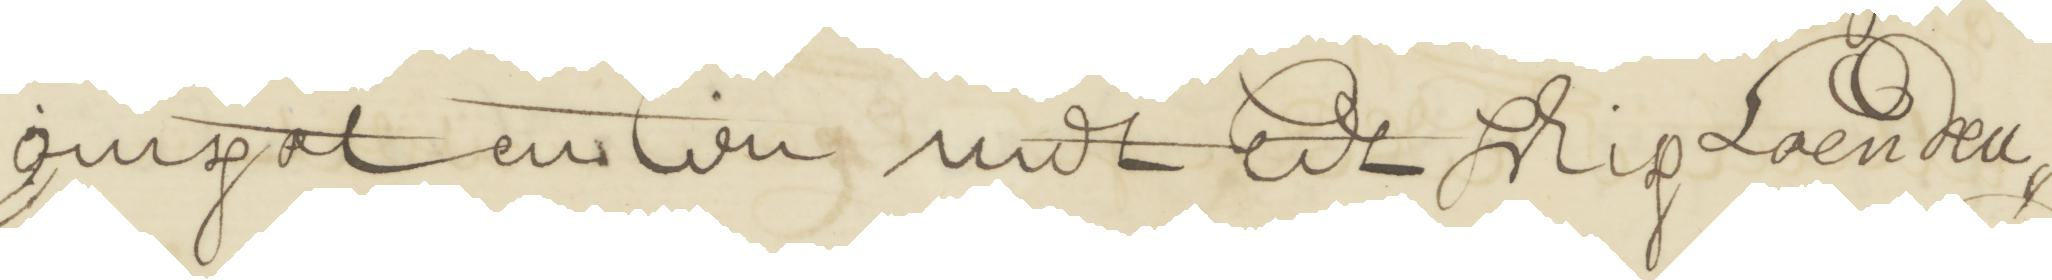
impotenten met het schip Loender
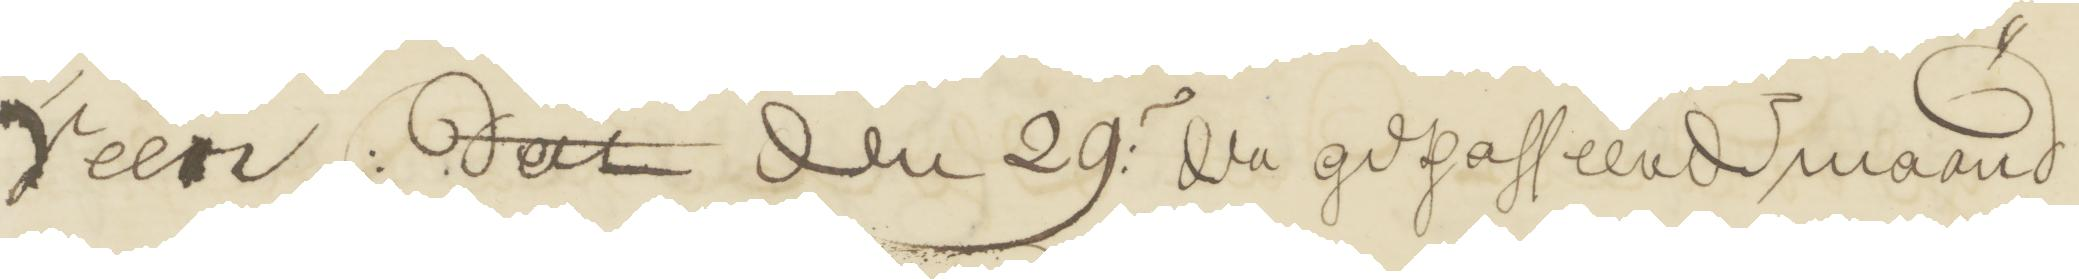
veen (:dat den 29:n der gepasseerde maand
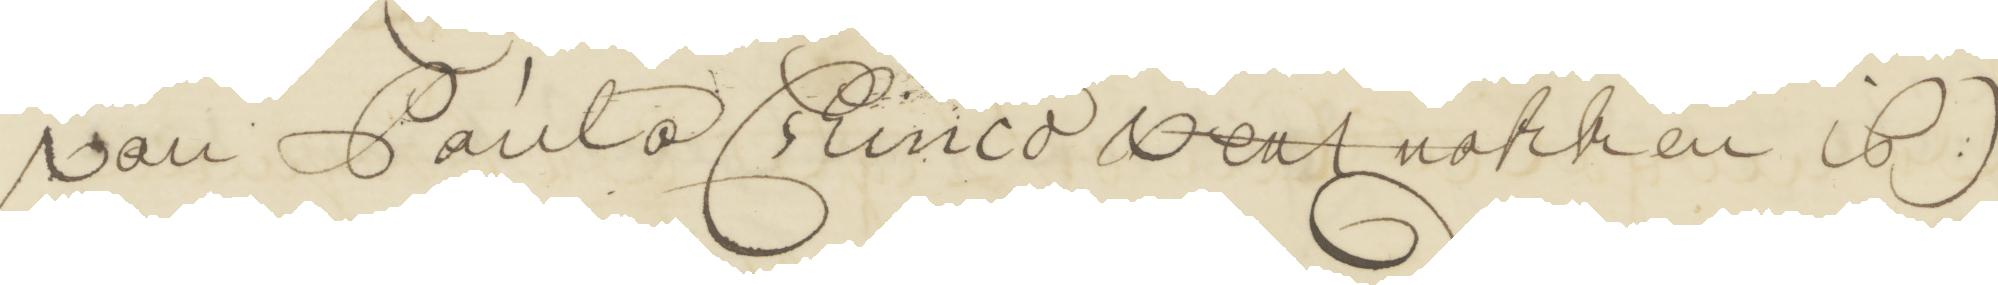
van Paulo Chinco vertrokken is:)
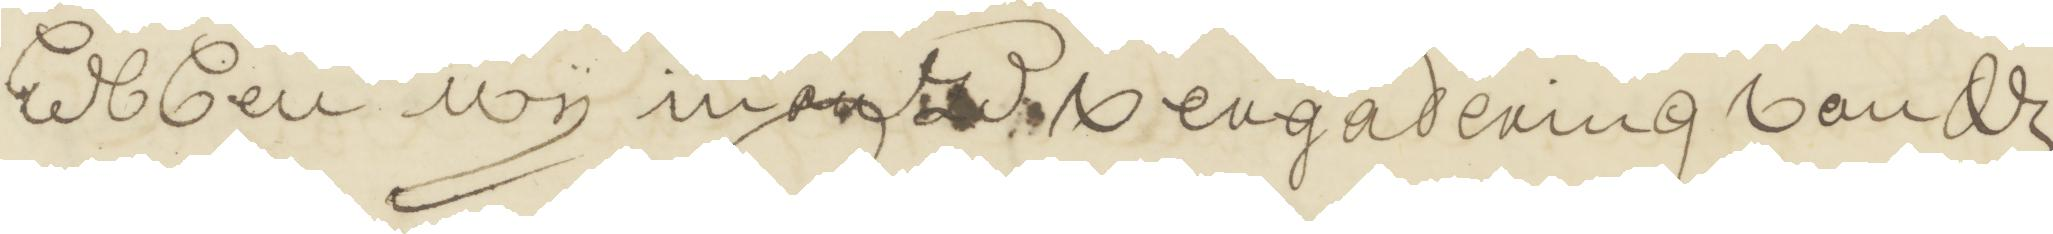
hebben wij in onze vergadering vanden
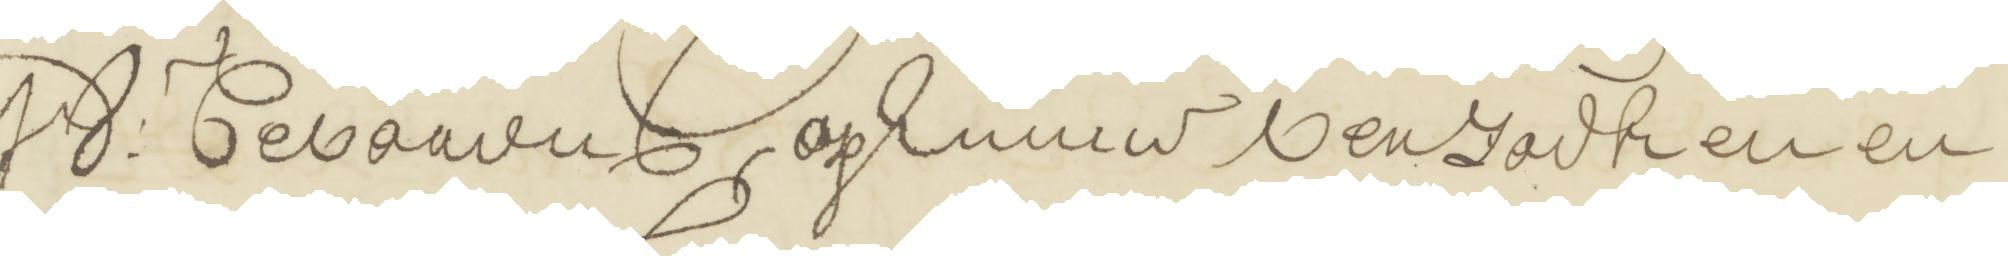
VE:n bevorens op hunne verzoeken en
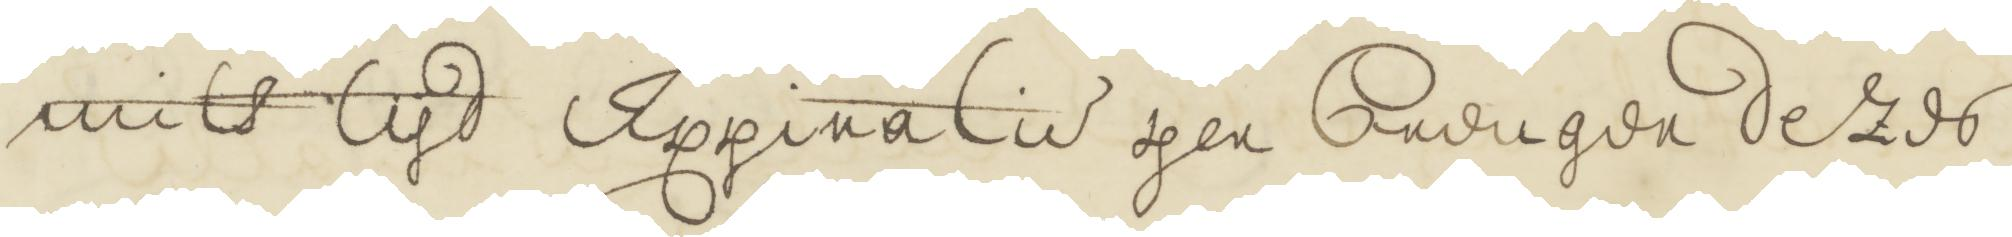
mits tijd Expiratie per brenger de zes
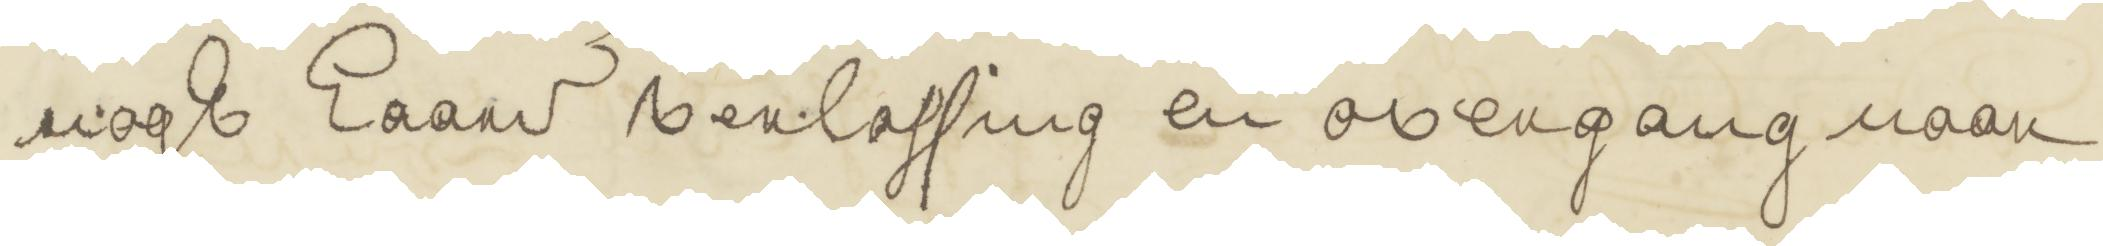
nogh haare verlossing en overgang naar
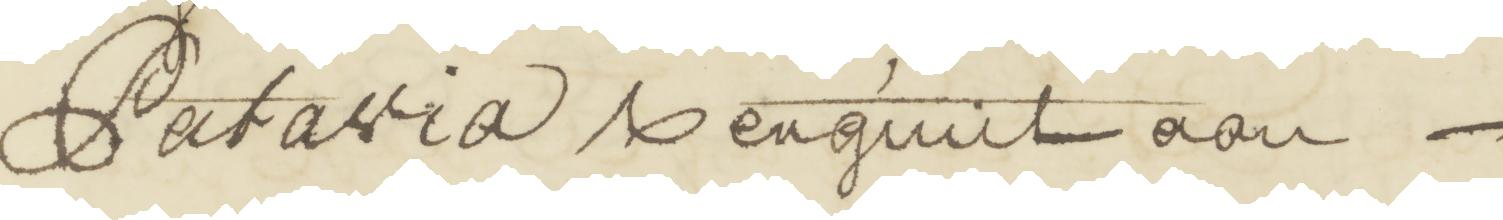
Batavia vergunt aan-
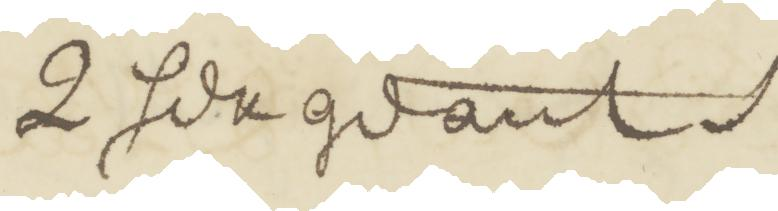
2 sergeants
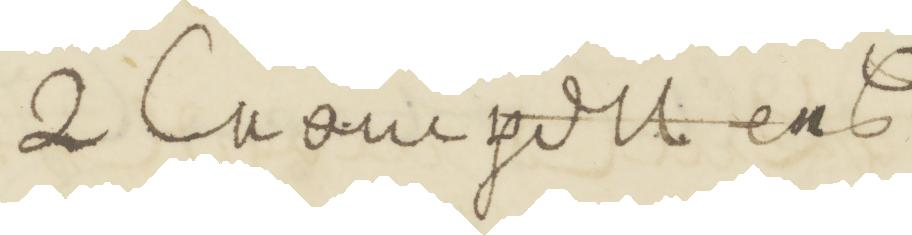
2 Crompetters
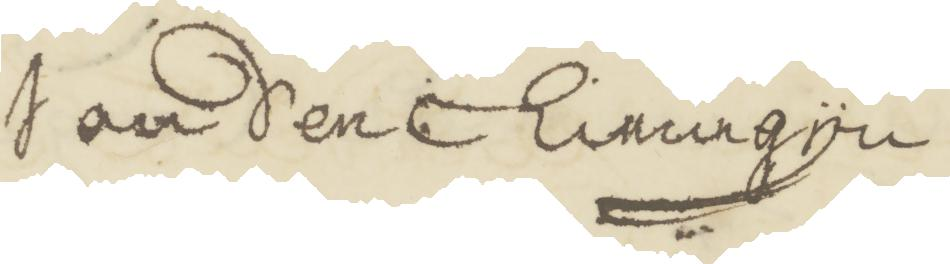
1 an den Chirurgijn
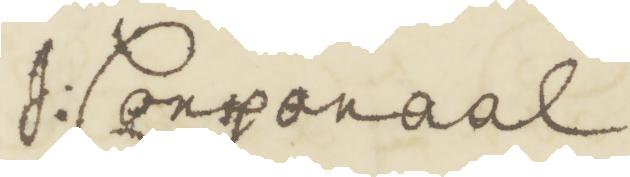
1: Corparaal
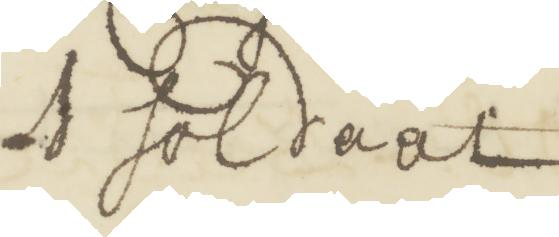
1 soldaat
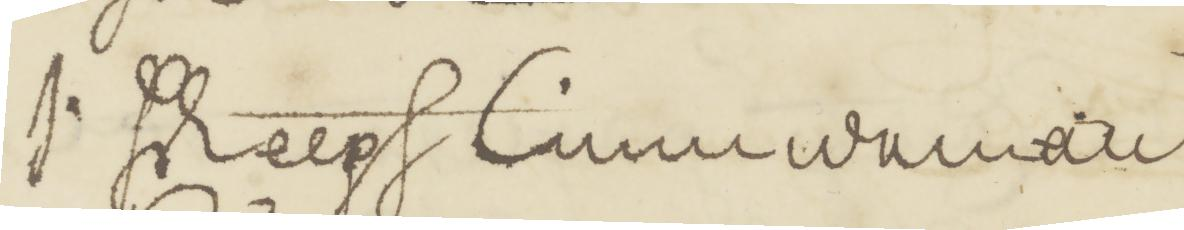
1. Scheeps timmerman
